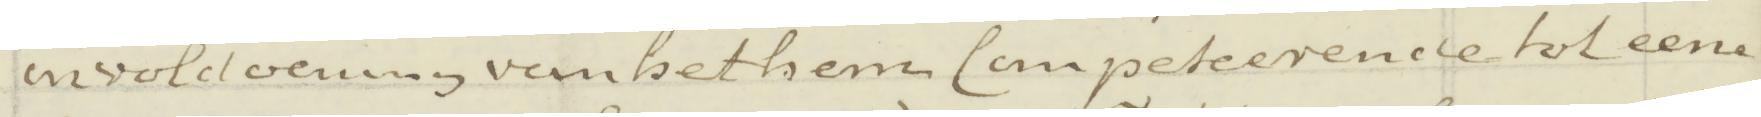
in voldoening van het hem Competeerende tot eene
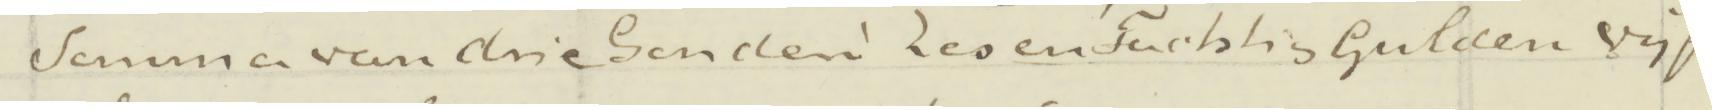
Somma van drie honderd zes en Tachtig Gulden vijf
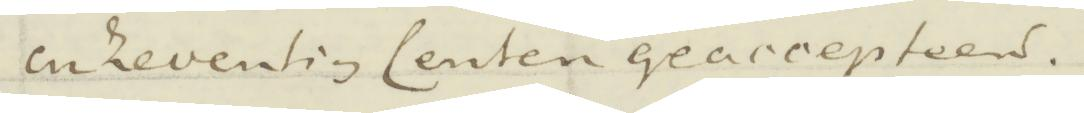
en zeventig Centen geaccepteerd.
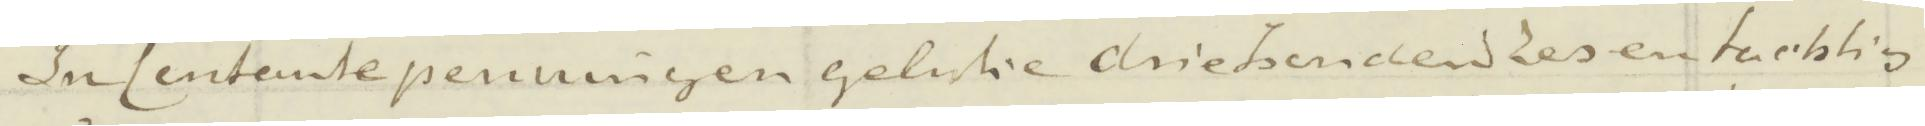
In Contante penningen gelijke drie honderd zes en tachtig
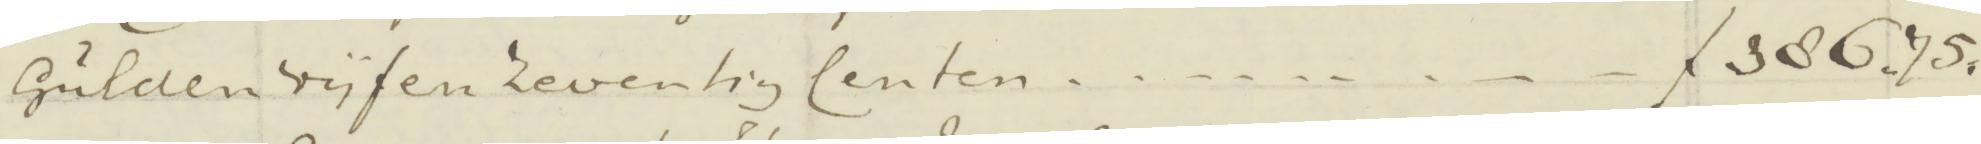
Gulden vijfen Zeventig Centen . . - - - - - - - - - - ƒ386„75
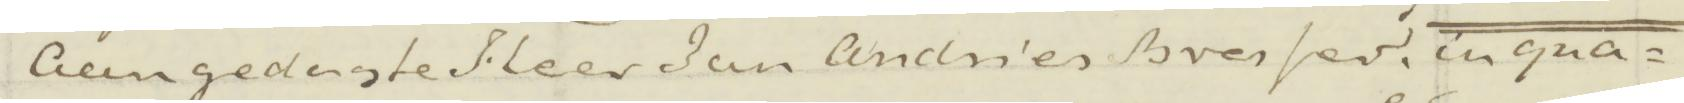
Aan gedagte Heer Jan Andries Bresser, in qua=
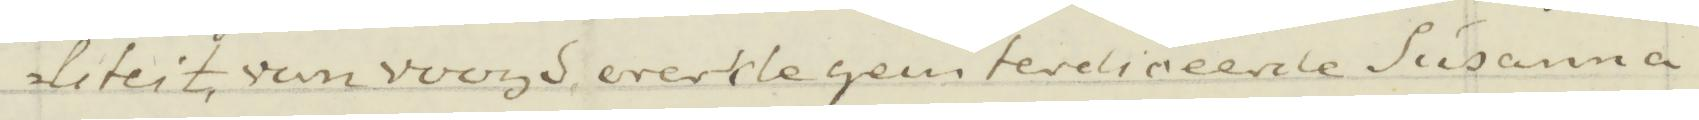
=liteit, van voogd over de geinterdiceerde Susanna
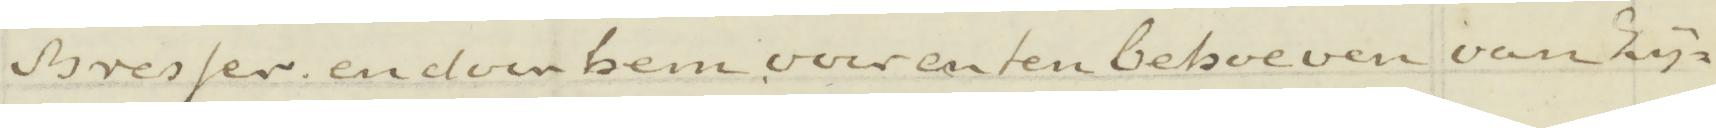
Bresser, en door hem voor en ten behoeven van zij=
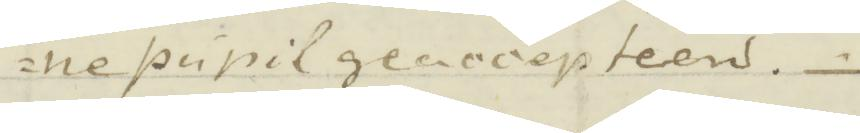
=ne pupil geaccepteerd.
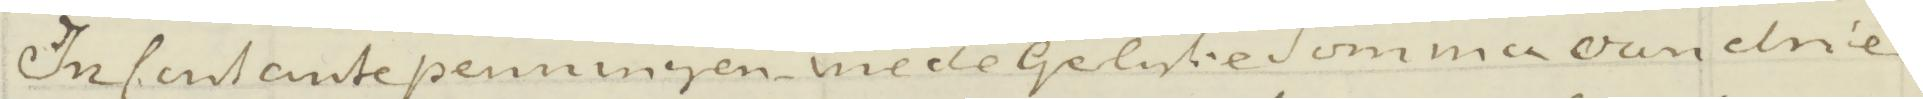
In Contante penningen mede Gelijke Somma van drie
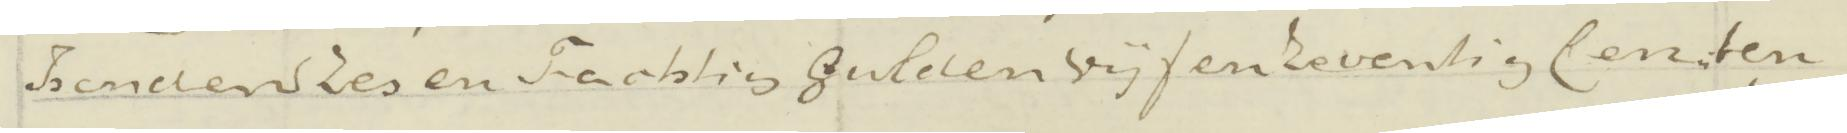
honderd zes en Tachtig Gulden vijf en zeventig Centen
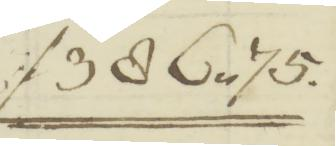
ƒ386„75.
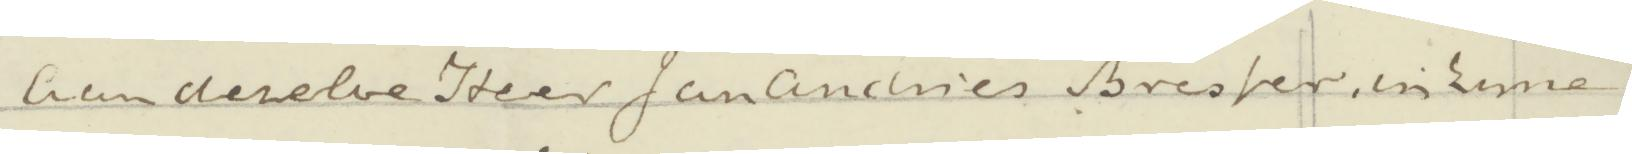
Aan dezelve Heer Jan Andries Bresser, in zijne
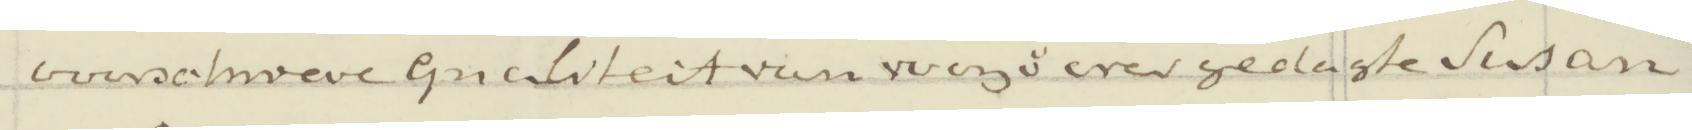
voorschreve qualiteit van voogd over gedagte Susan
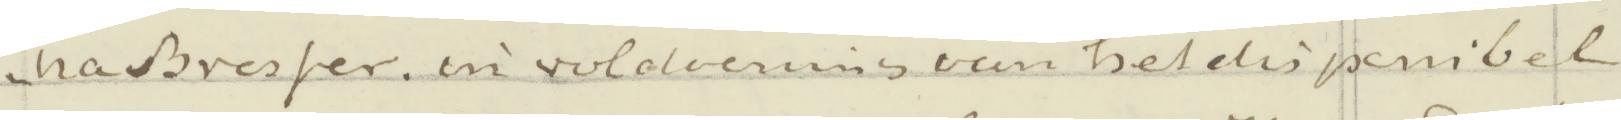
=na Bresser, in voldoening van het disponibel
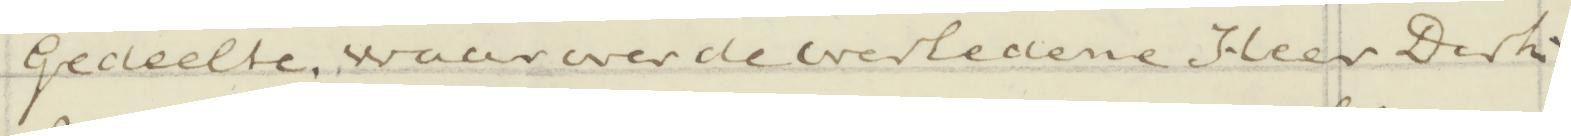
Gedeelte, waar over de overledene Heer Dirk
